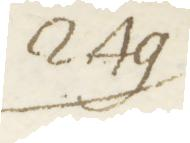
249.
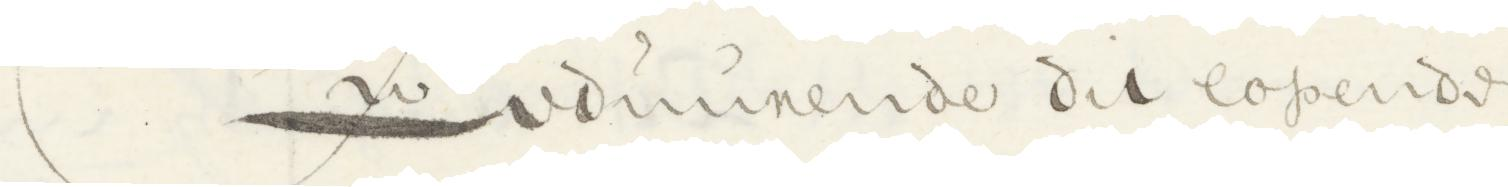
Geduurende dit lopende
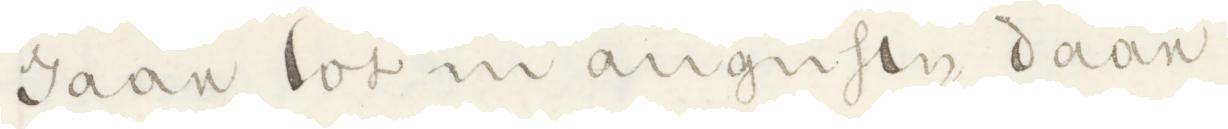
Iaar tot in augustij daar
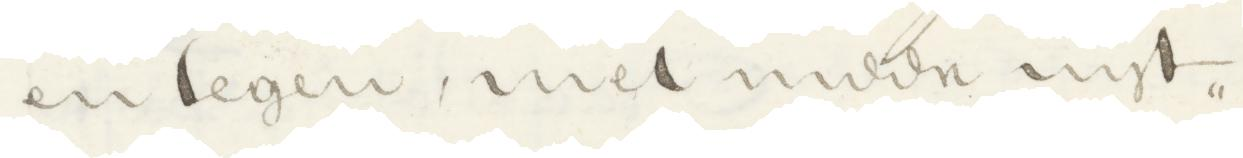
en tegen, niet meer uijt„
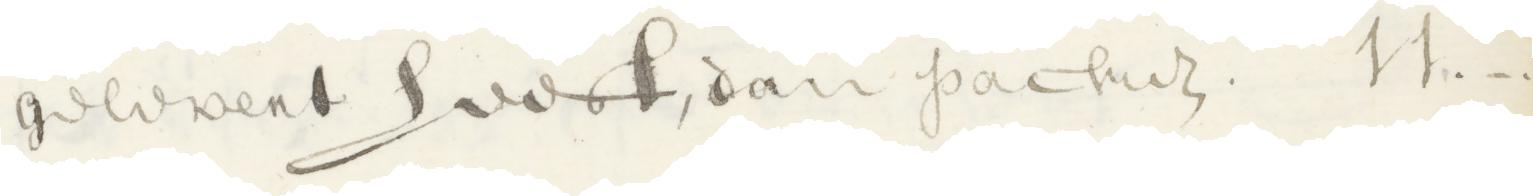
gelevert heeft, dan packen. 11.-
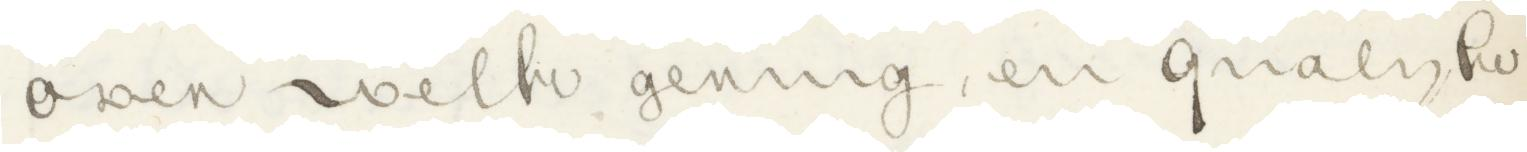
over welk gering, en qualijke
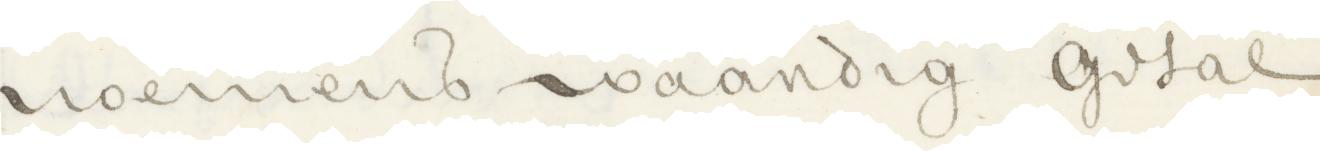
noemens waardig getal
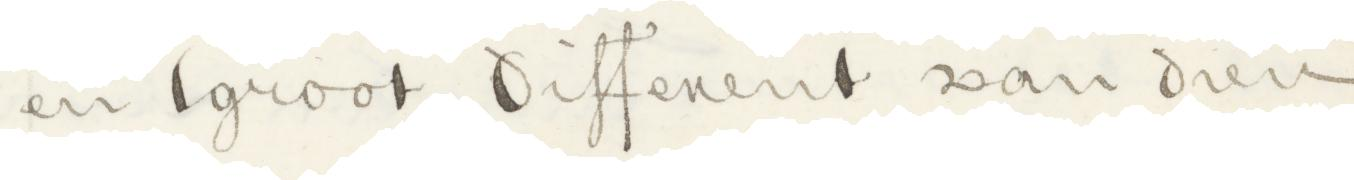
en 't groot different van dien
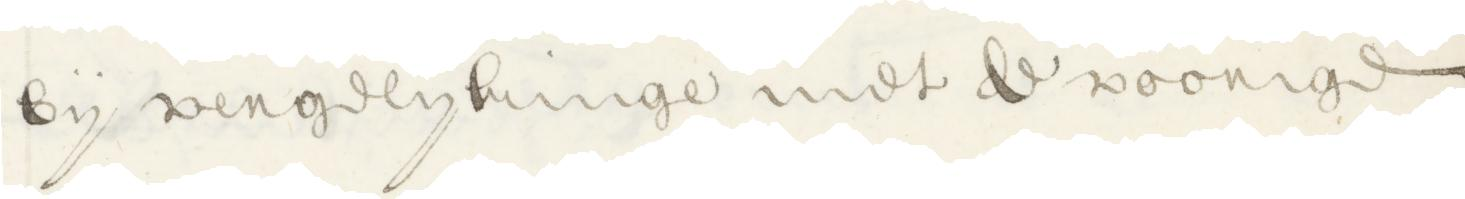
bij vergelijkinge met de voorige
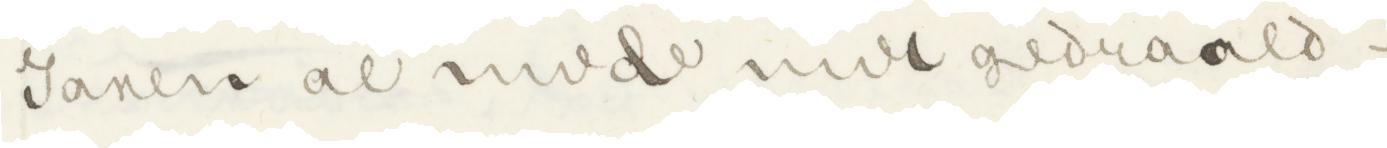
Iaren al mede niet gedraald
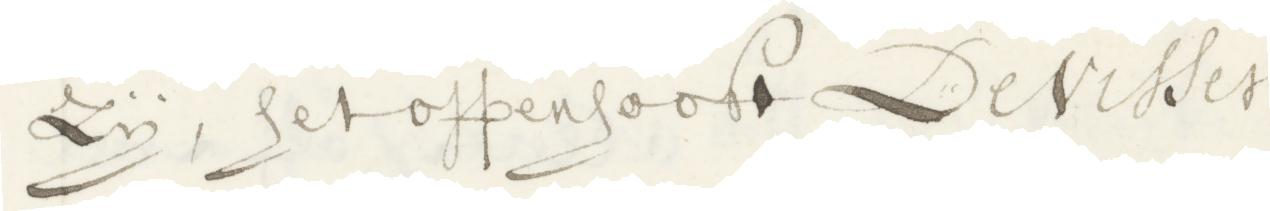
zij, het opperhooft DeVisser
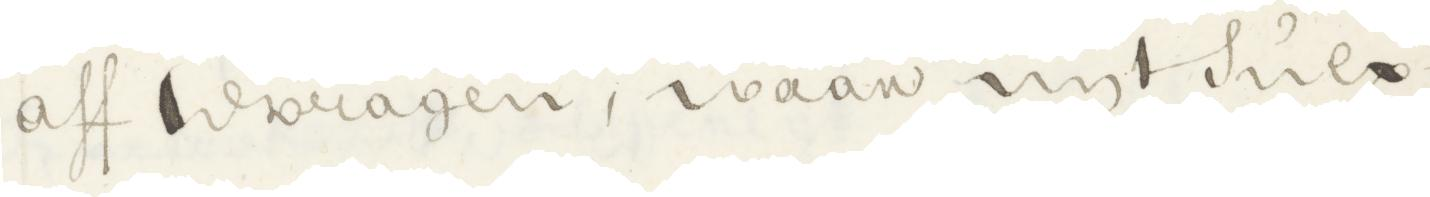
aff tevragen; waar uijtsulx
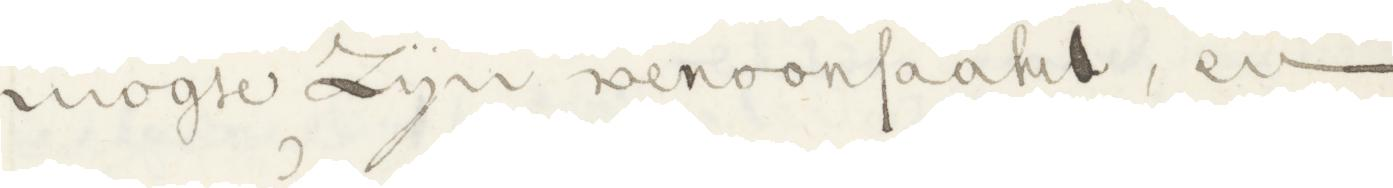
mogte zijn veroorsaakt, en
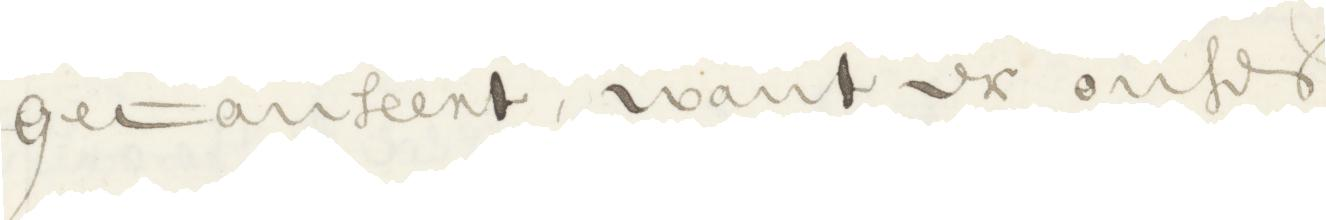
gecauseert, want er onses
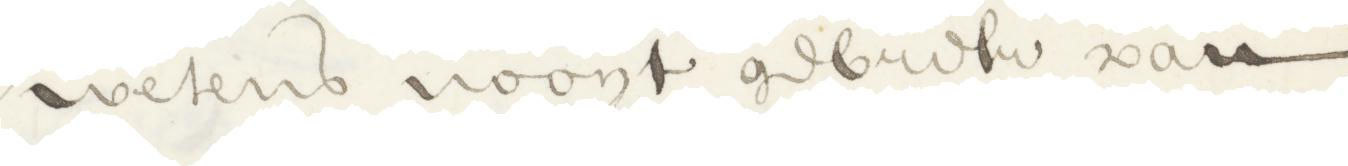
wetens nooijt gebrek van
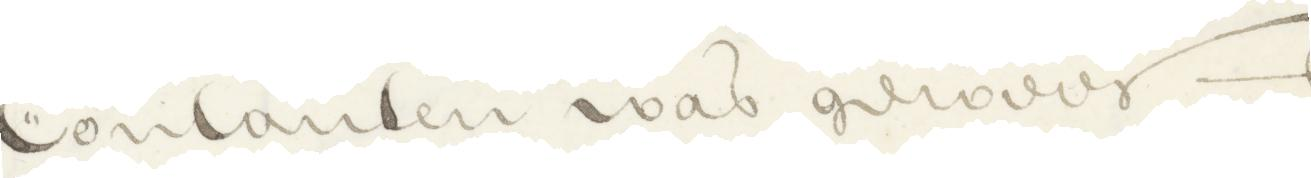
Contanten was gewees —
